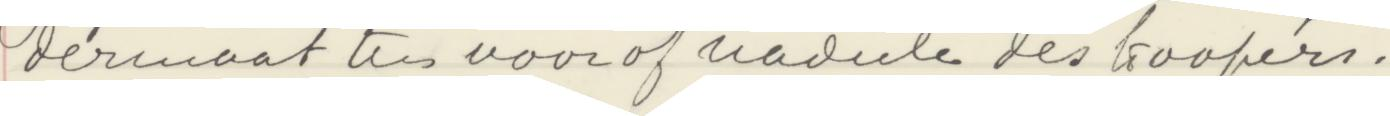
dermaat ten voor of nadeele des koopers.
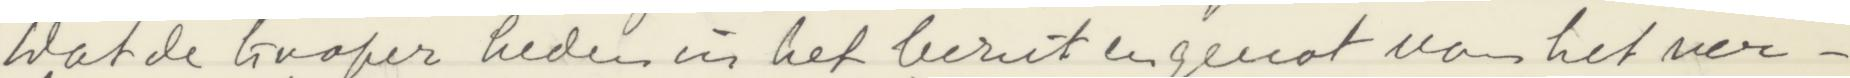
Dat de koper heden in het bezit en genot van het ver-
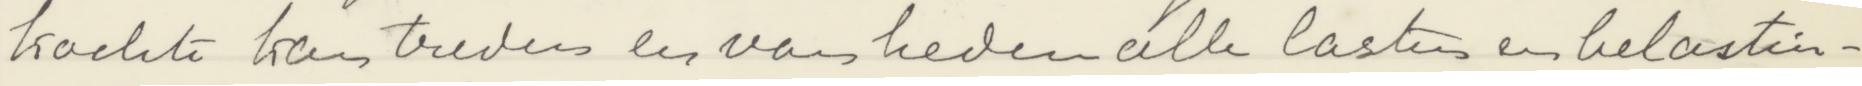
kochte kan treden en van heden alle lasten en belastin-
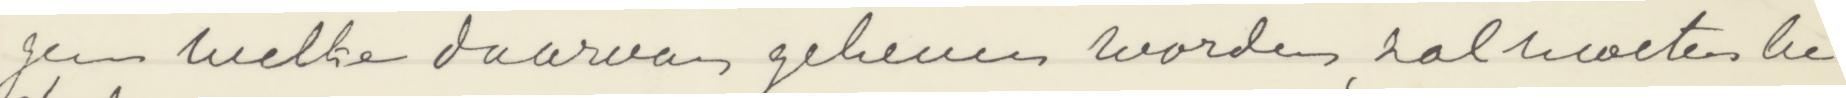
gen welke daarvan geheven worden zal moeten be.
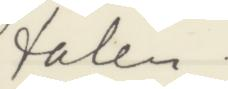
talen
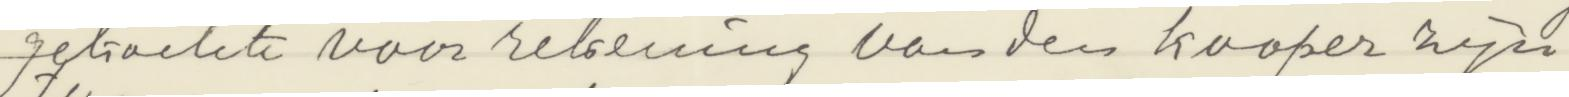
gekochte voor rekening van den kooper zijn
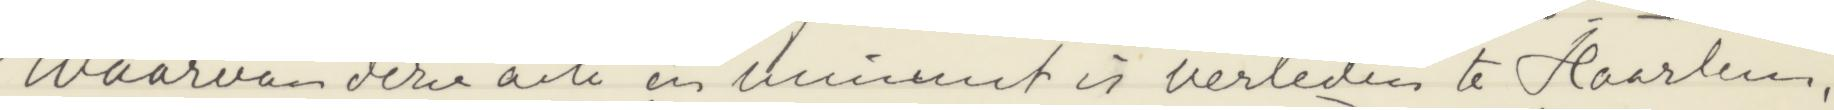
Waarvan deze acte in drievout is verleden te Haarlem,
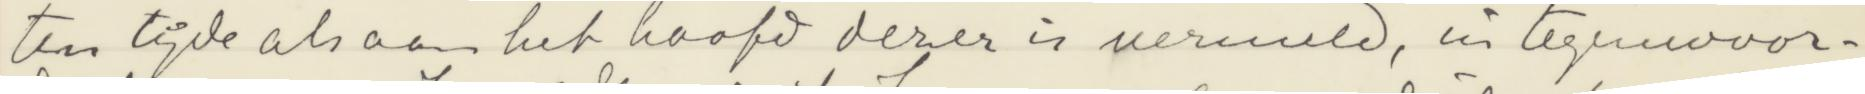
ten tijde als aan het hoofd dezer is vermeld, in tegenwoor-
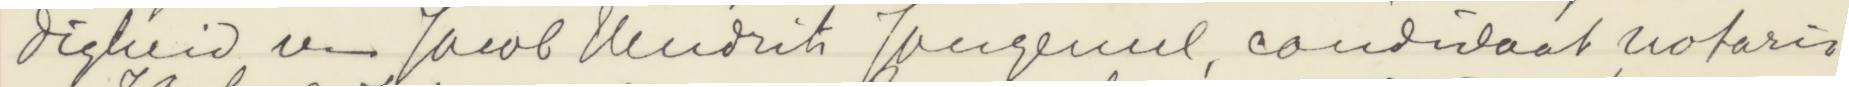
digheid van Jacob Hendrik Jongeneel, candidaat notaris
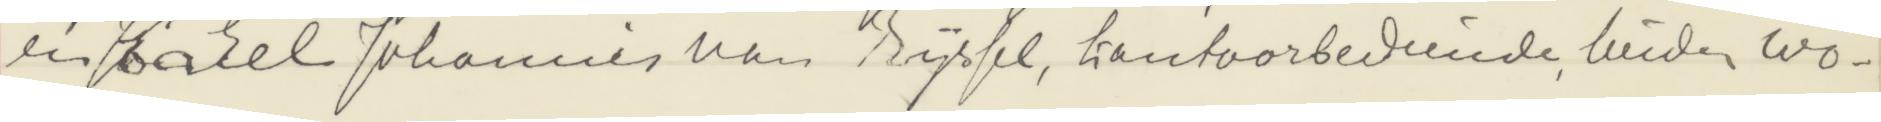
en Carel Johannis van Rijssel, kantoorbediende, beiden wo-
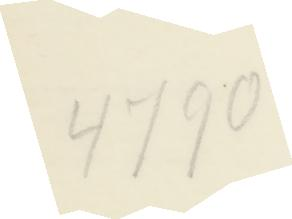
4790
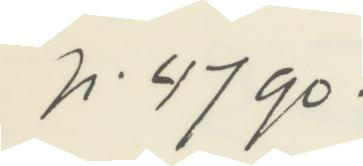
n. 4790
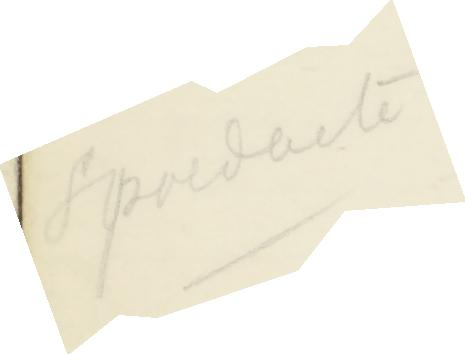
Spoedacte
